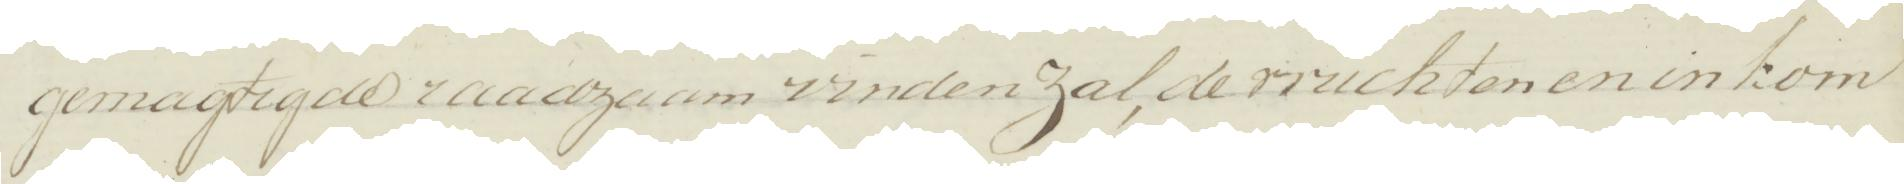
gemagtigde raadzaam vinden zal, de vruchten en in kom
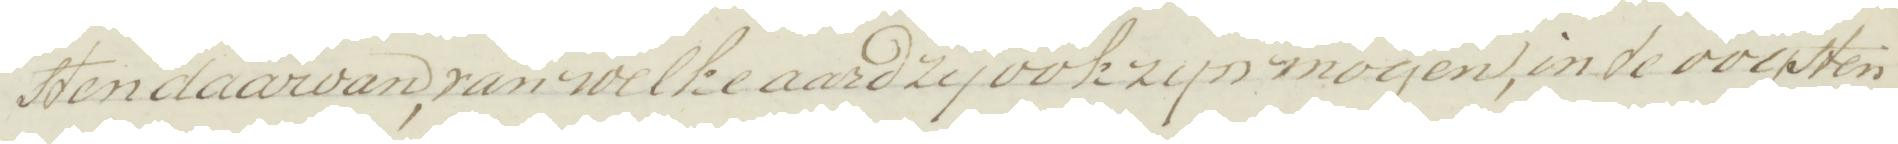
sten daarvan, van welke aard zy ook zyn mogen, in de oogsten,
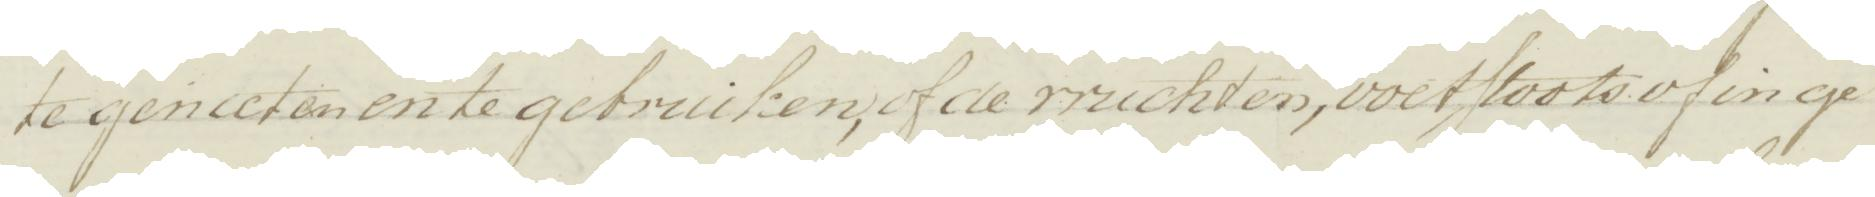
te genieten en te gebruiken, of de vruchten, voetstoots of in ge
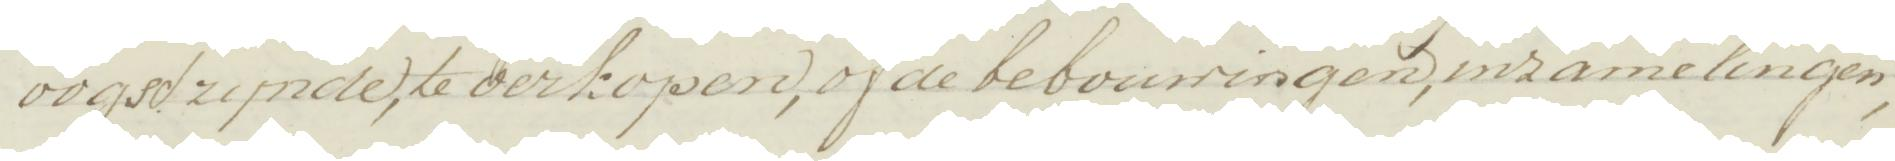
oogst zynde, te verkopen, of de bebouwingen, inzamelingen,
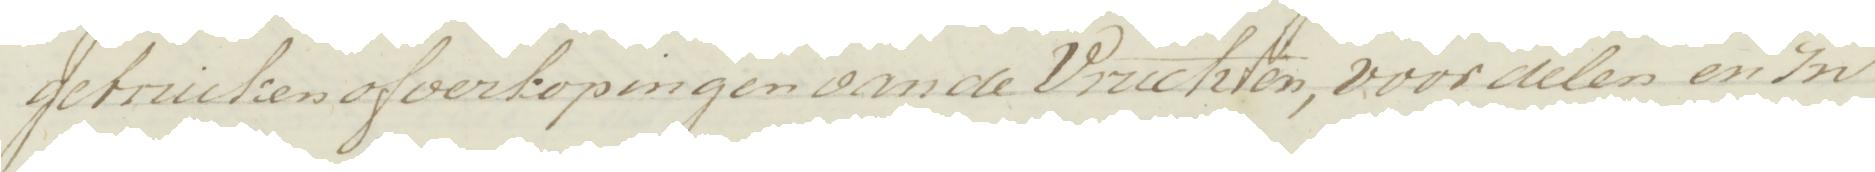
gebruiken of verkopingen om de Vruchten, voordelen en In
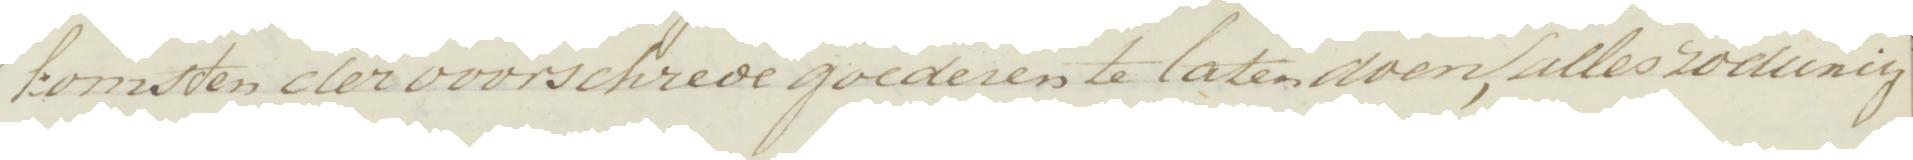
komsten der voorschreve goederen te laten doen, alles zodanig
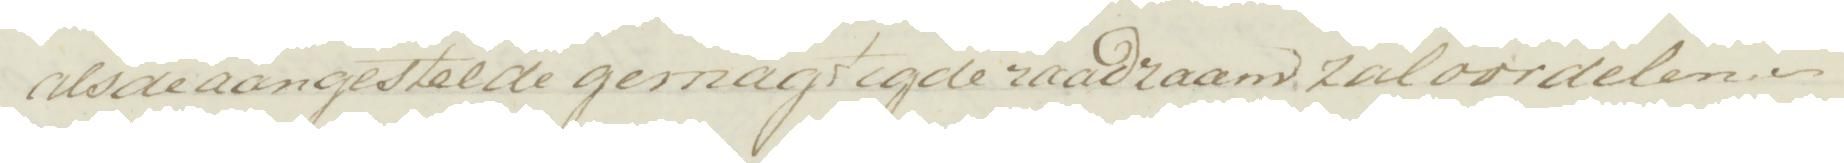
als de aangestelde gemagtigde raadzaam zal oordelen. –
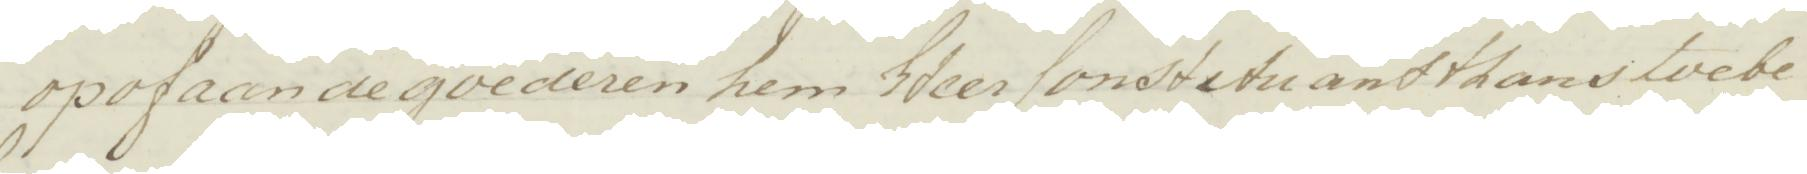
op of aan de goederen hem Heer Constituant thans toebe
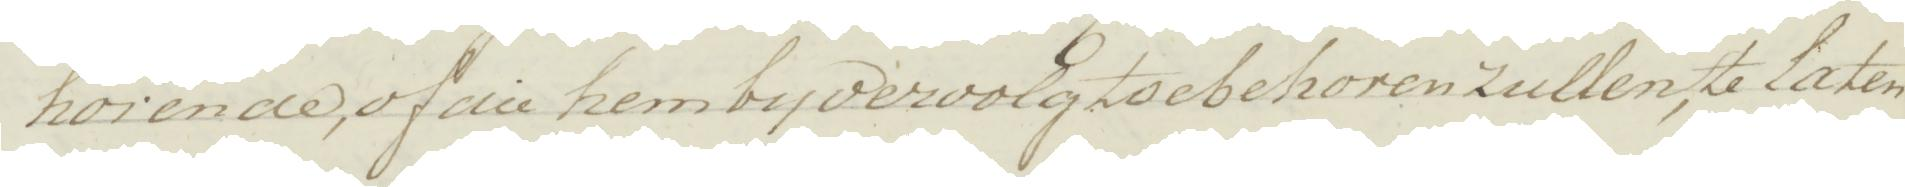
horende, of die hem by vervolg toebehoren zullen, te laten
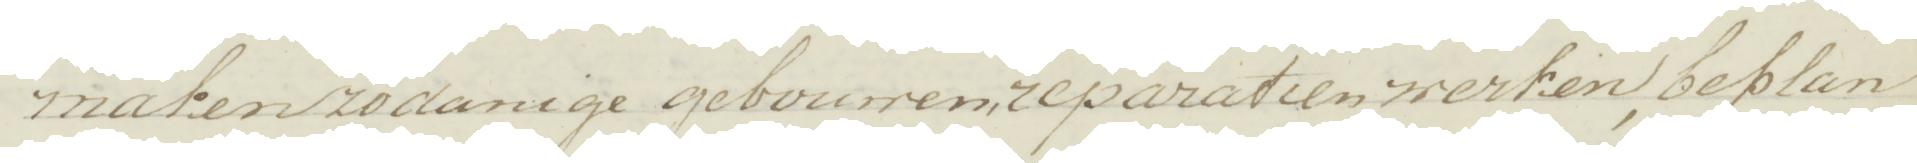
maken zodanige gebouwen, reparatien, werken, beplan
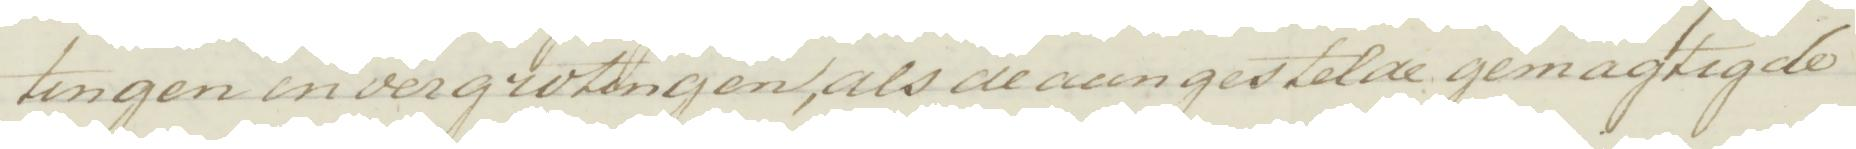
tingen en vergrotingen, als de aangestelde gemagtigde
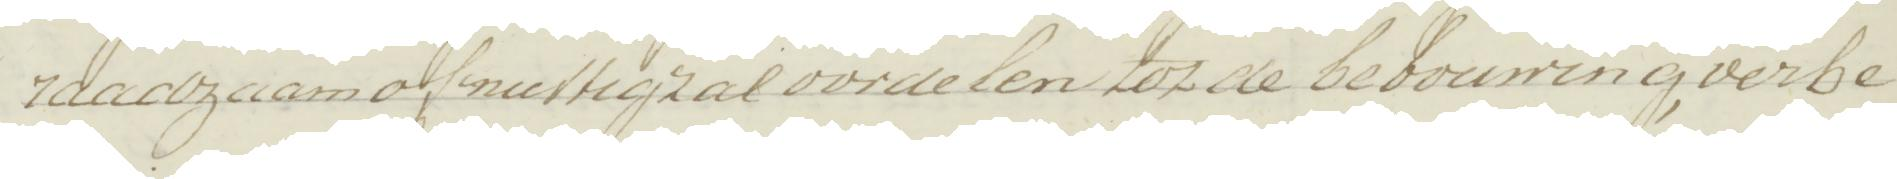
raadzaam of nuttig zal oordelen tot de bebouwing, verbe
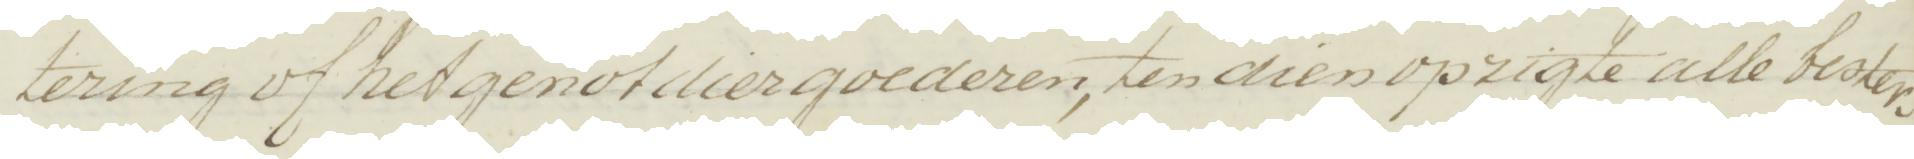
tering of het genot dier goederen, ten dien opzigte alle bestek
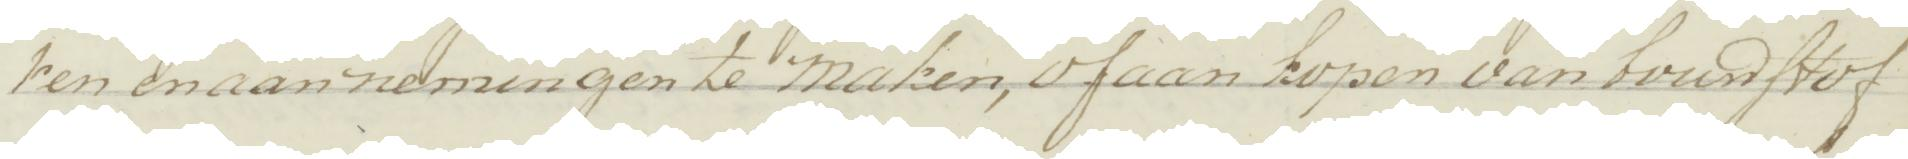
ken en aannemingen te maken, of aan kopen van bouwstof
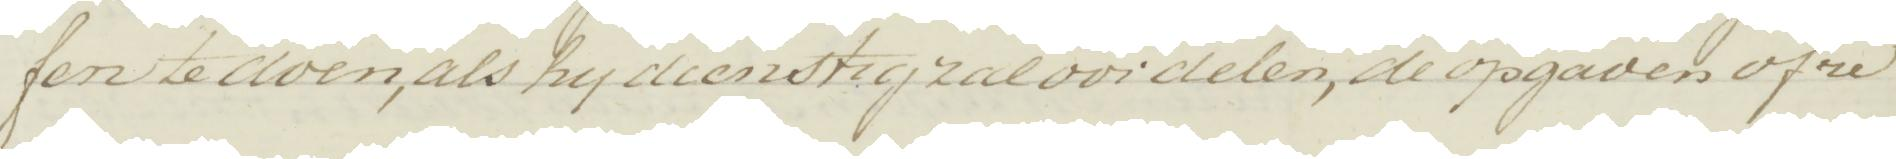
fen te doen, als hy dienstig zal oordelen, de opgaven of re
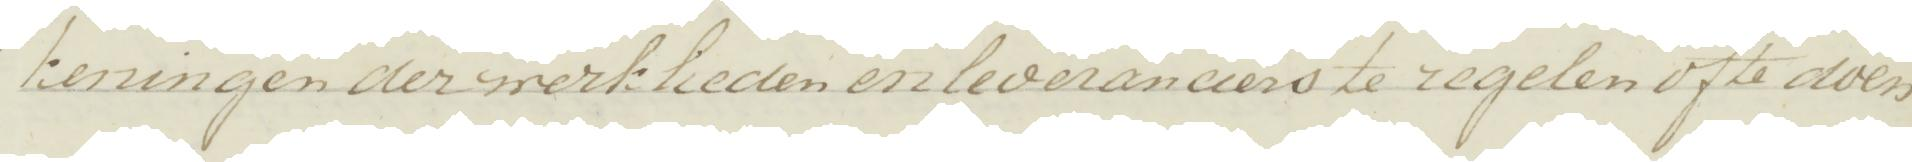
keningen der werklieden en leveranciers te regelen of te doen
